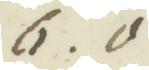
6. d
